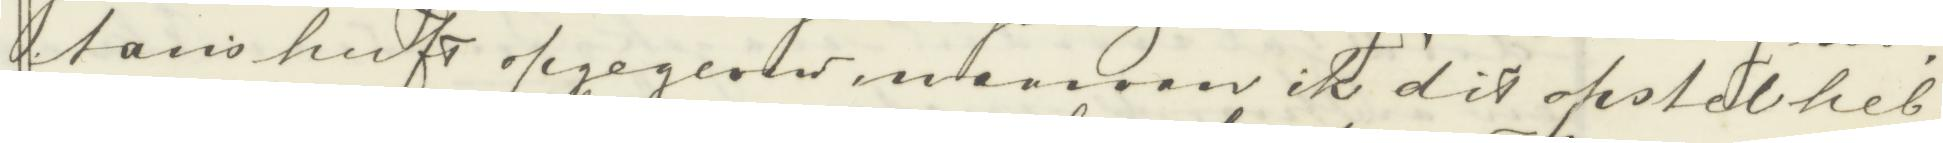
taris heeft opgegeven, waarvan ik dit opstel heb
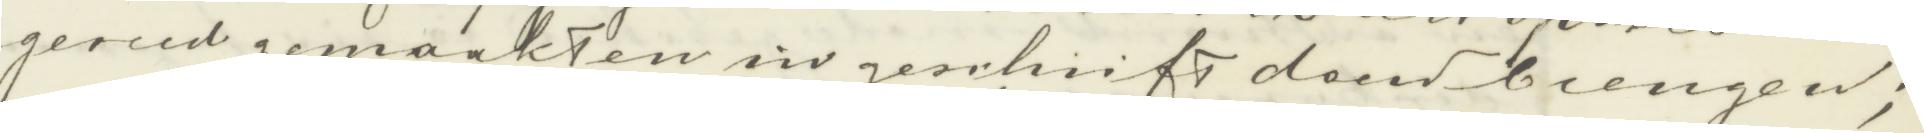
gereed gemaakt en in geschrift doen brengen;
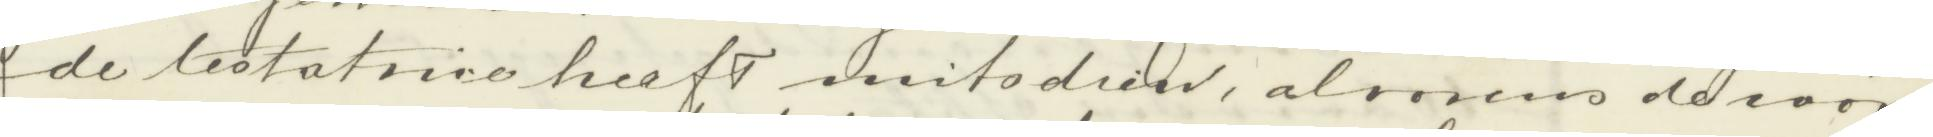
de testatrice heeft mitsdien, alvorens de voor
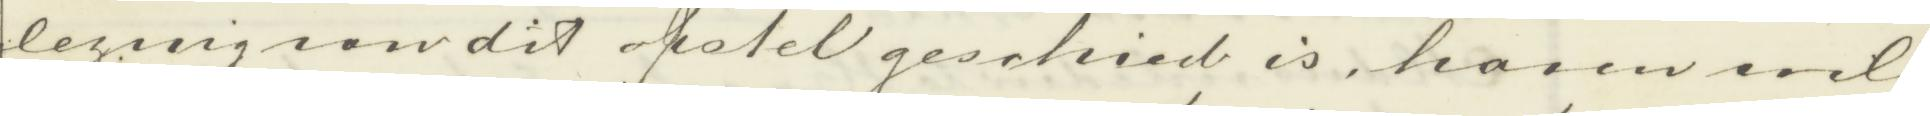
lezing van dit opstel geschied is, haren wil
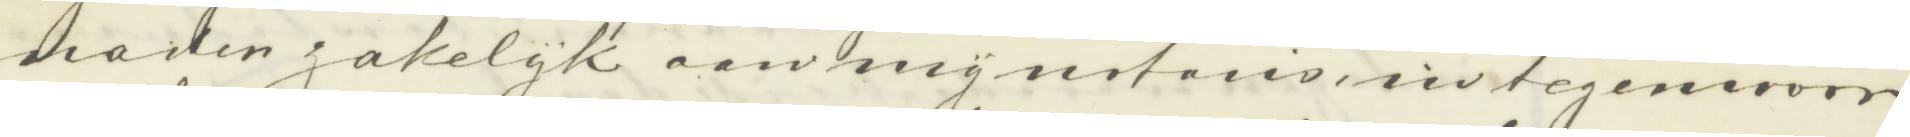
nader zakelijk aan mij notaris, in tegenwoor
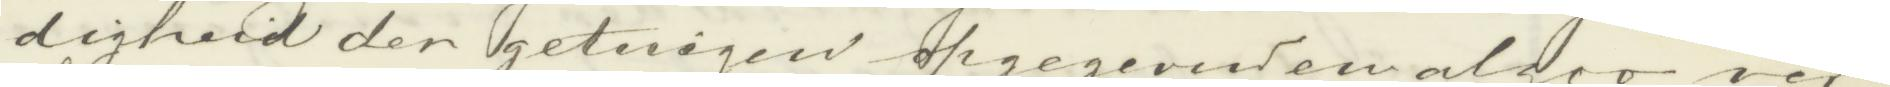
digheid der getuigen opgegeven en alzoo ver
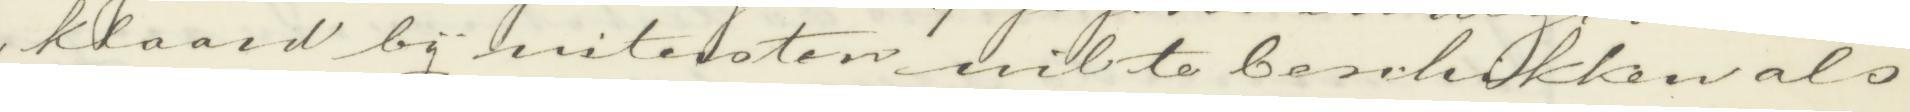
klaard bij uitersten wil te beschikken als
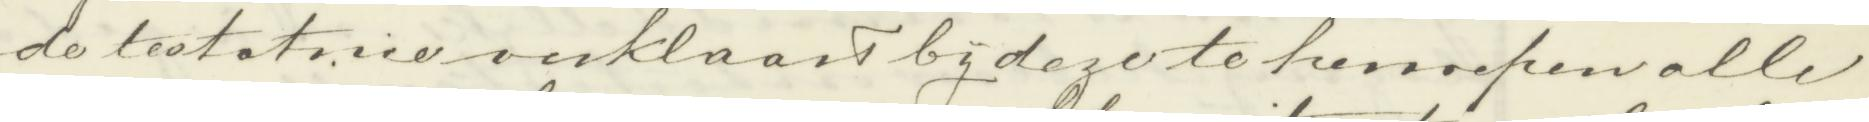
de testatrice verklaart bij deze te herroepen alle
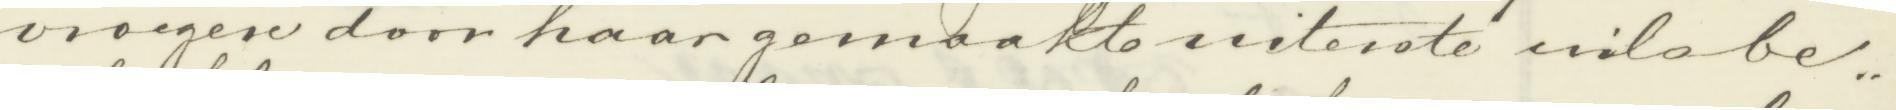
vroeger door haar gemaakt uiterste wilsbe„
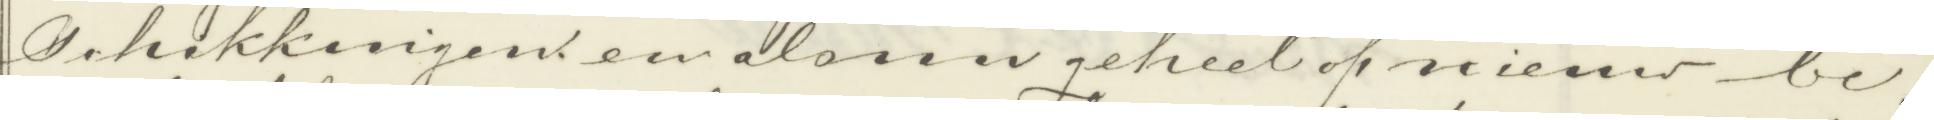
schikkingen en alsnu geheel opnieuw be„
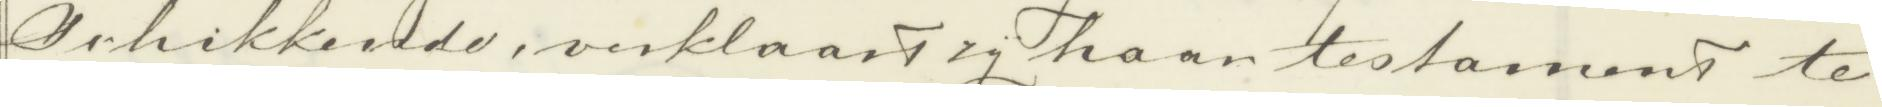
schikkende, verklaard zij haar testament te
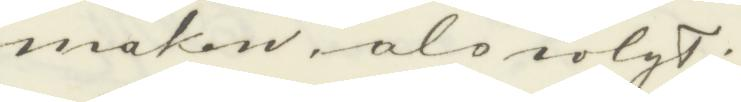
maken, als volgt.
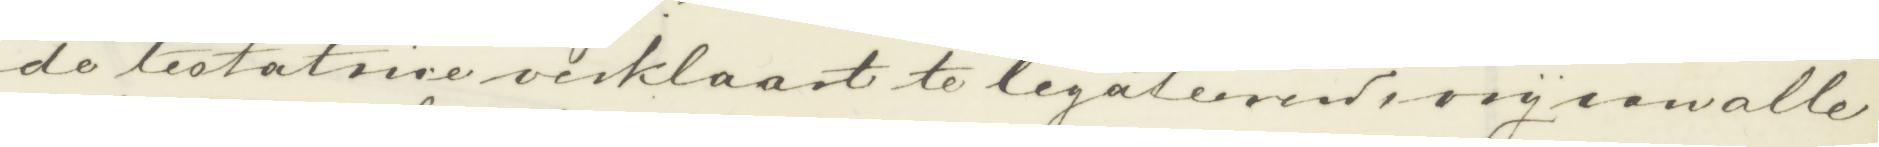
de testatrice verklaart te legateeren, vrij van alle
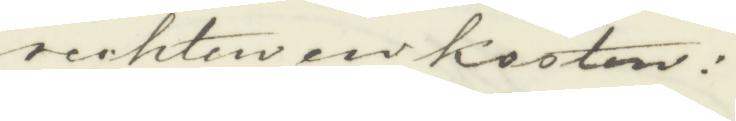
rechten en kosten:
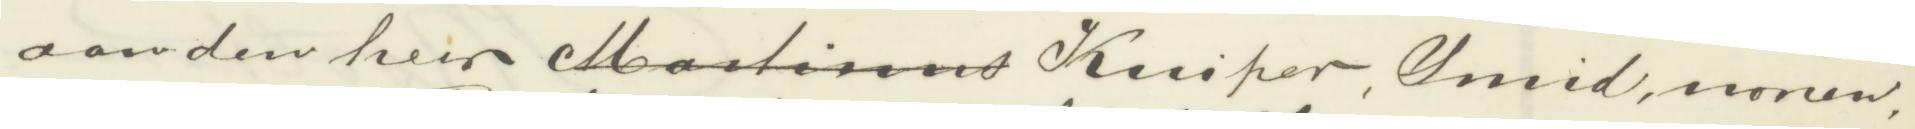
aan den heer Martinus Kuiper, Smid, wonen,
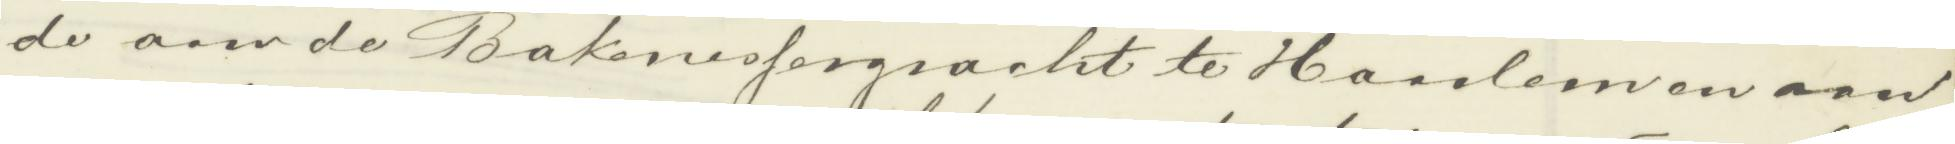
de aan de Bakenessergracht te Haarlem en aan
